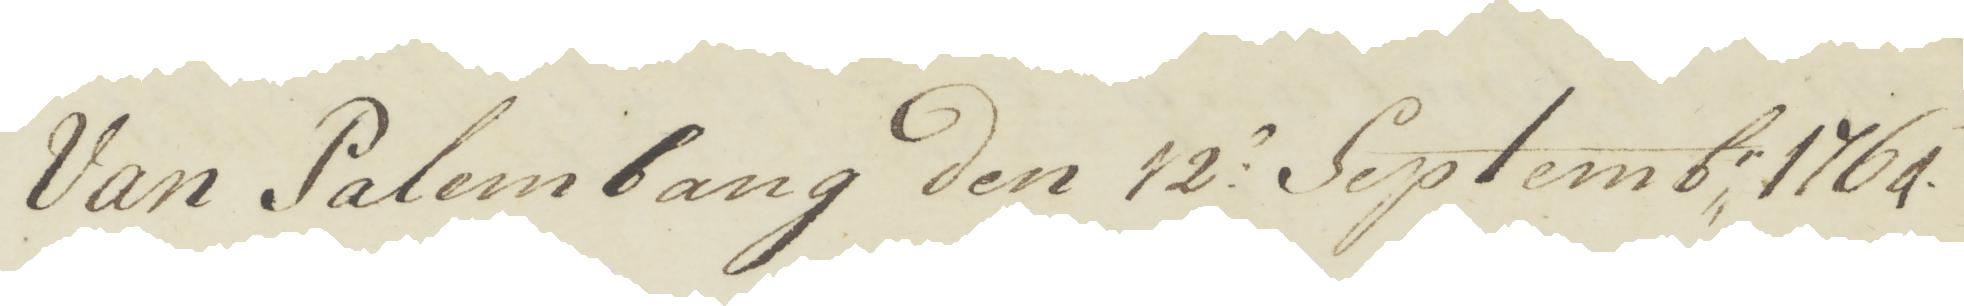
Van Palembang den 12:' Septemb„r 1764.
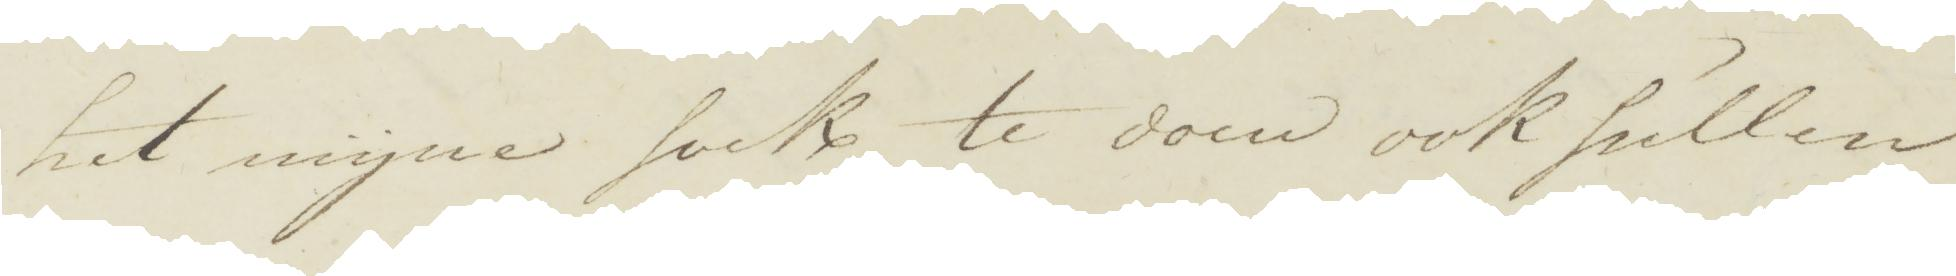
het mijne soek te doen ook sullen
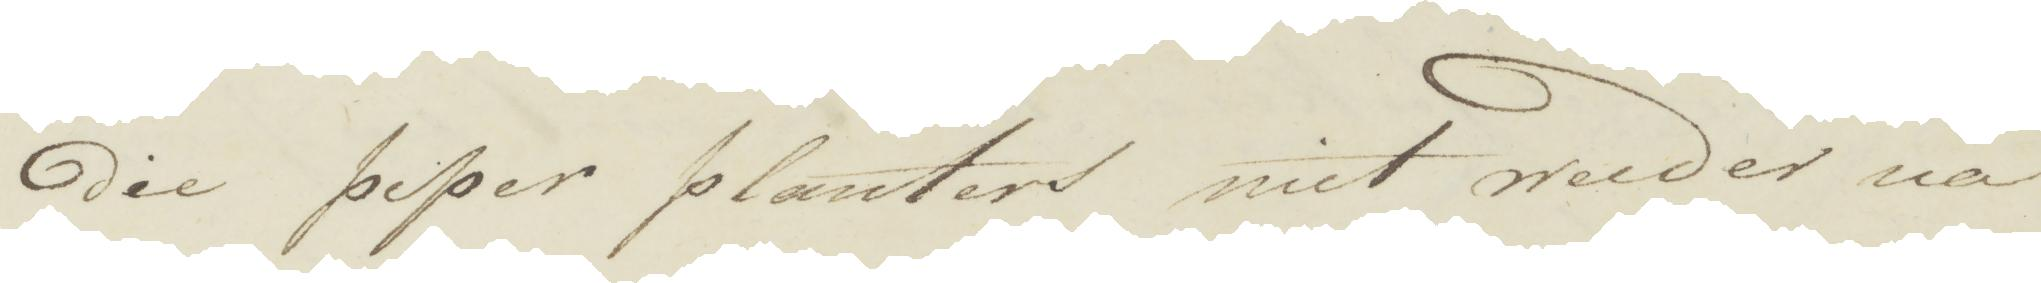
die peper planters niet weeder na
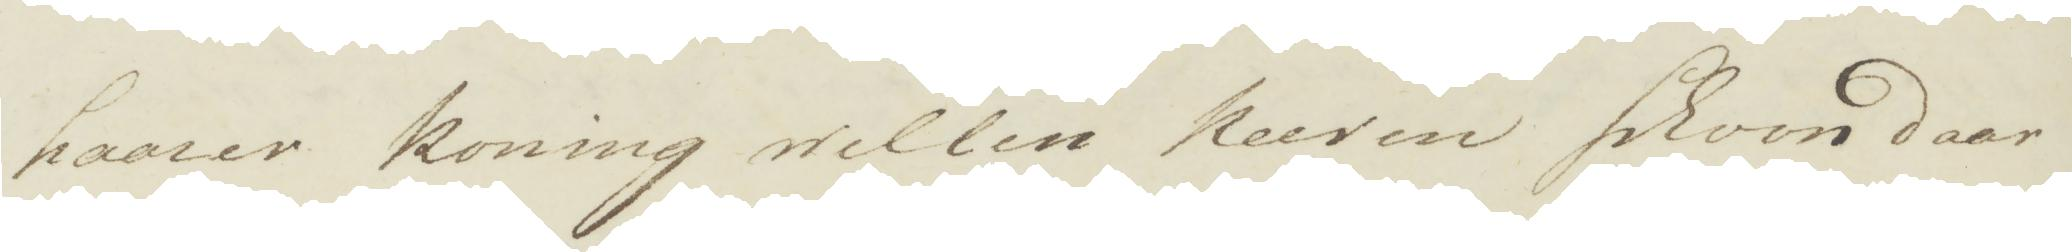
haarer Koning willen Keeren Schoon daar
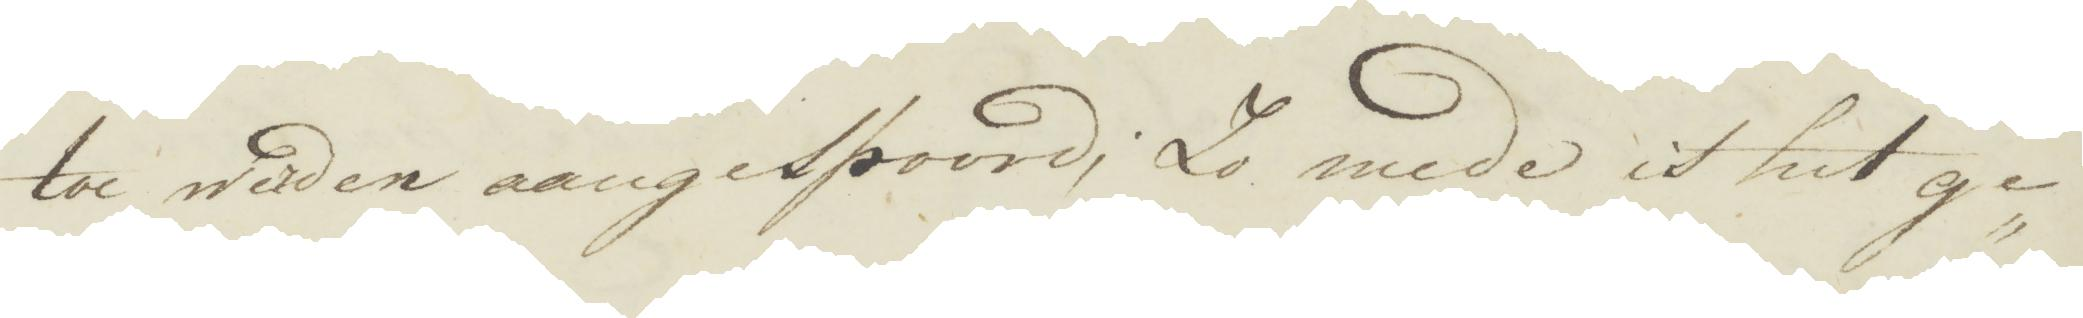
toe werden aangespoord; Zo mede is het ge„
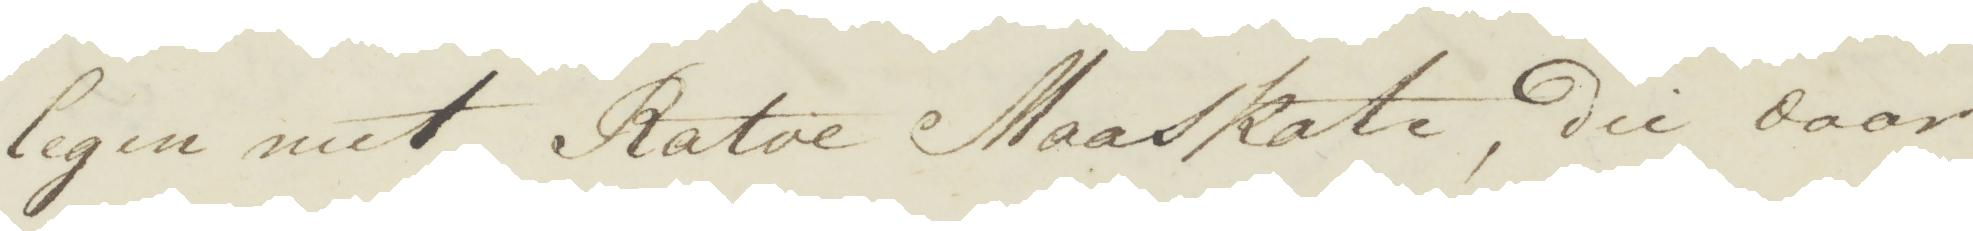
legen met Ratoe Maaskate, die daar
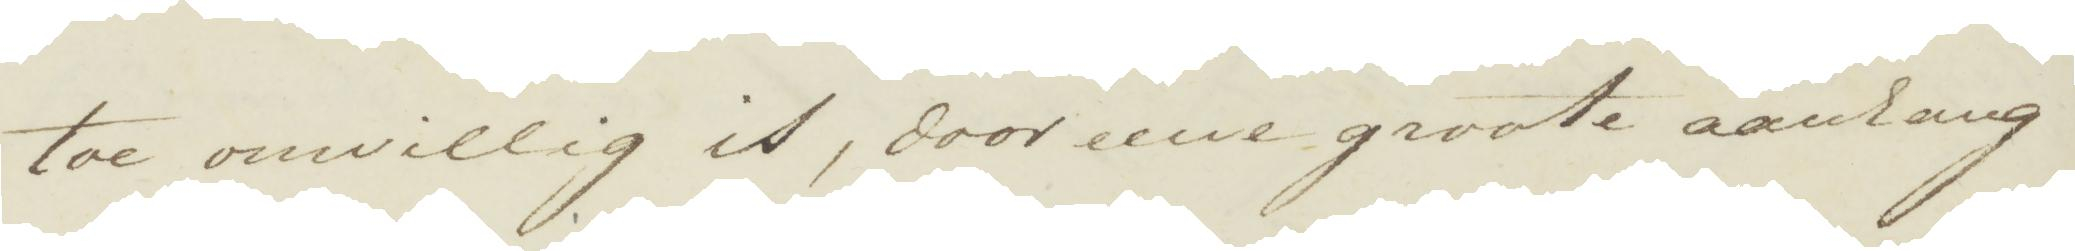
toe onwillig is, door eene groote aanhang
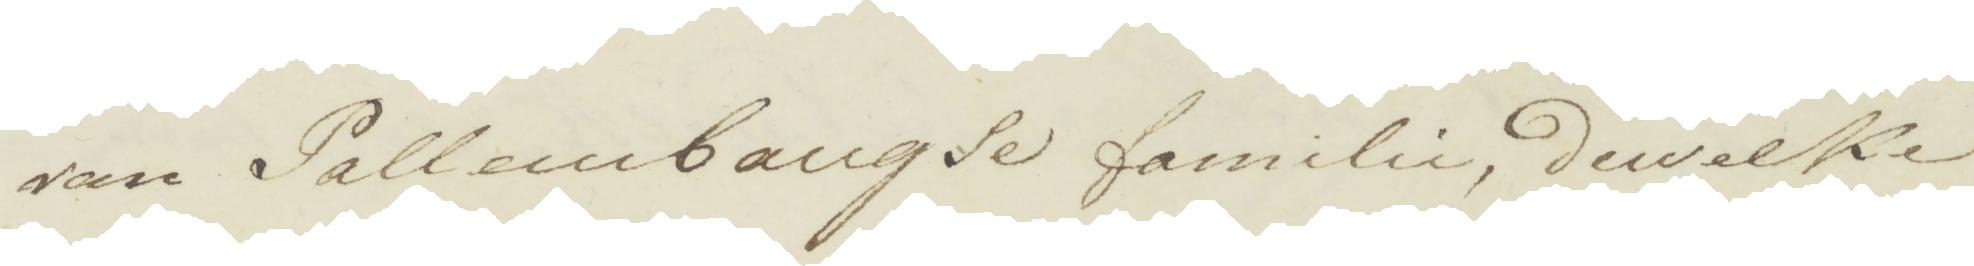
van Pallembangse familie, dewelke
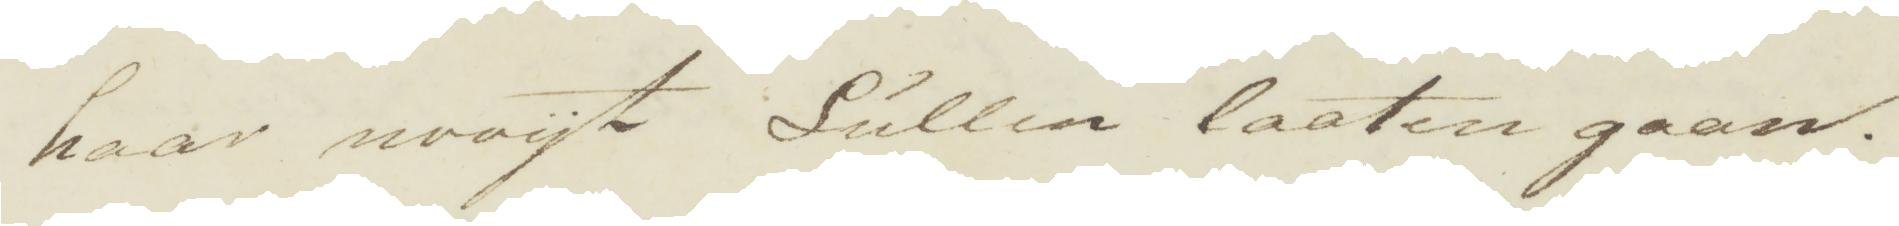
haar nooijt Sullen laaten gaan.
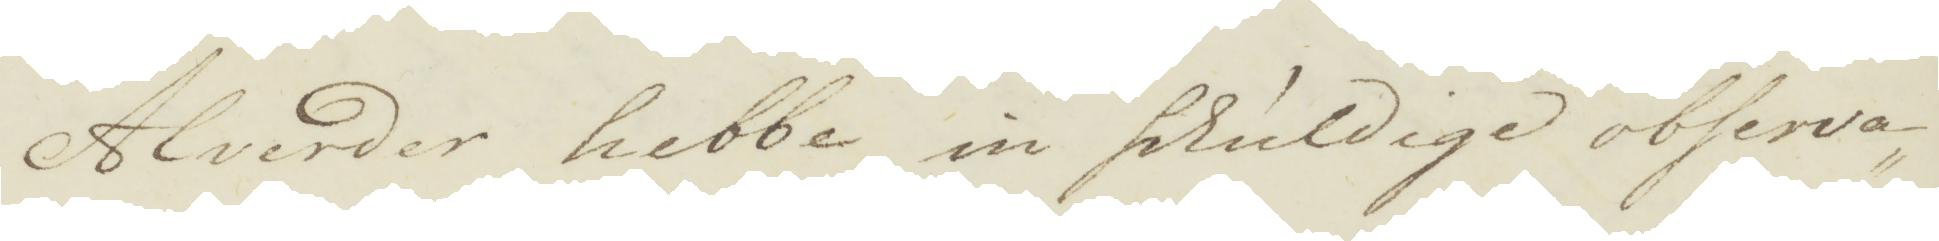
Alverder hebbe in Schuldige observa„
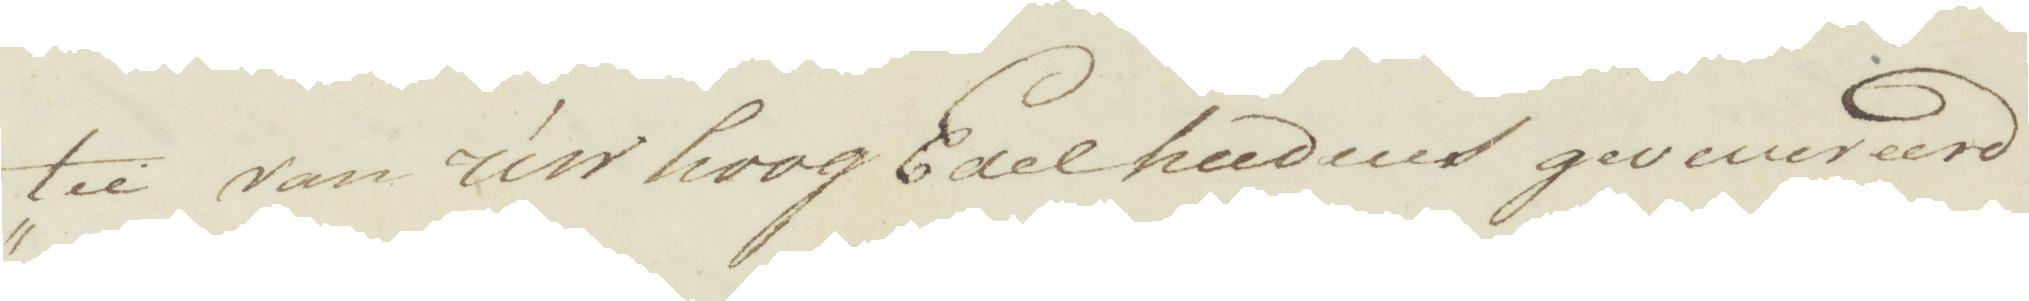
„tie van UW hoog Edelheedens gevenereerd
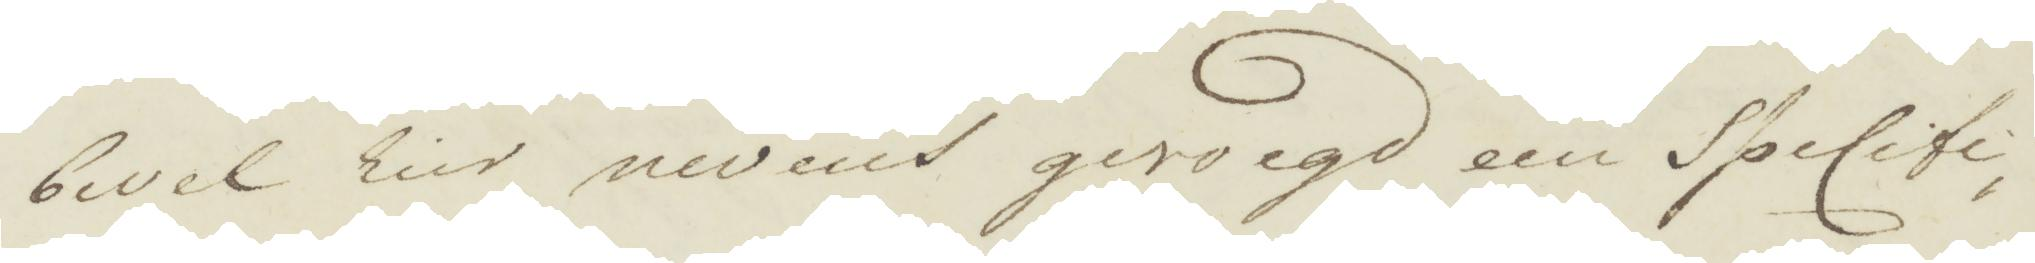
bevel hier nevens gevoegd een Specifi„
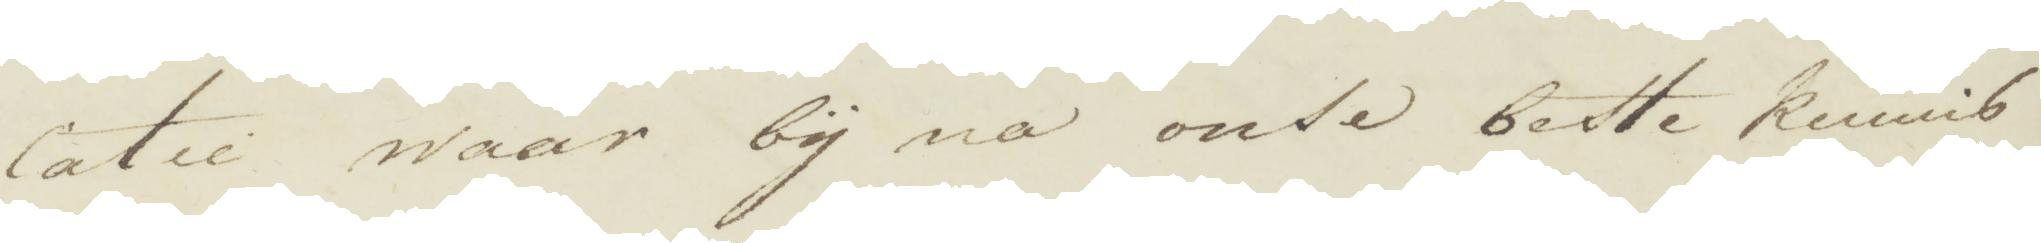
Catie waar bij na onse beste Kennis
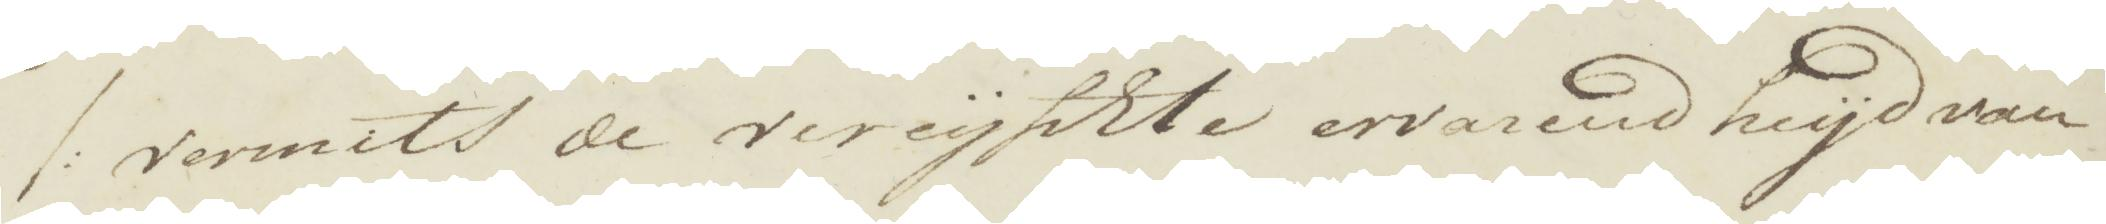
/: vermits de vereijschte ervarendheijd van
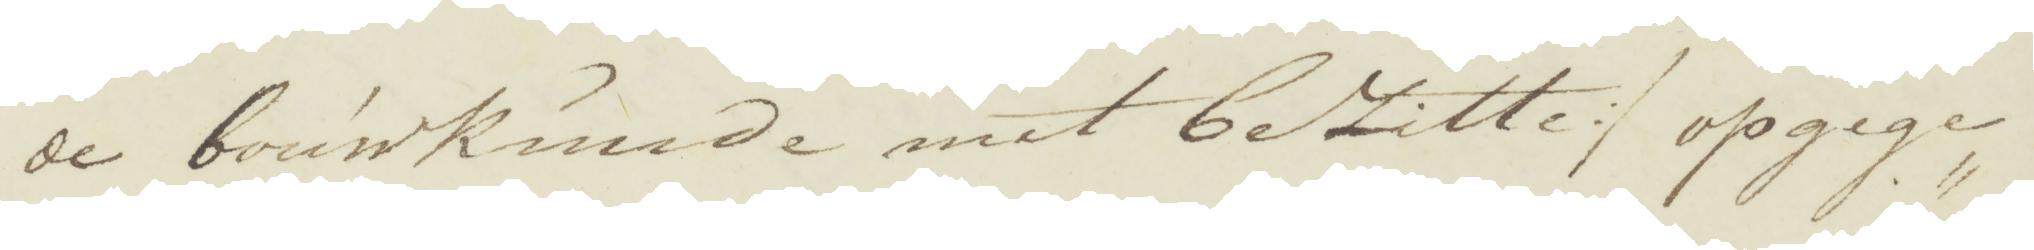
de bouwkunde niet bezitte:/ opgege„
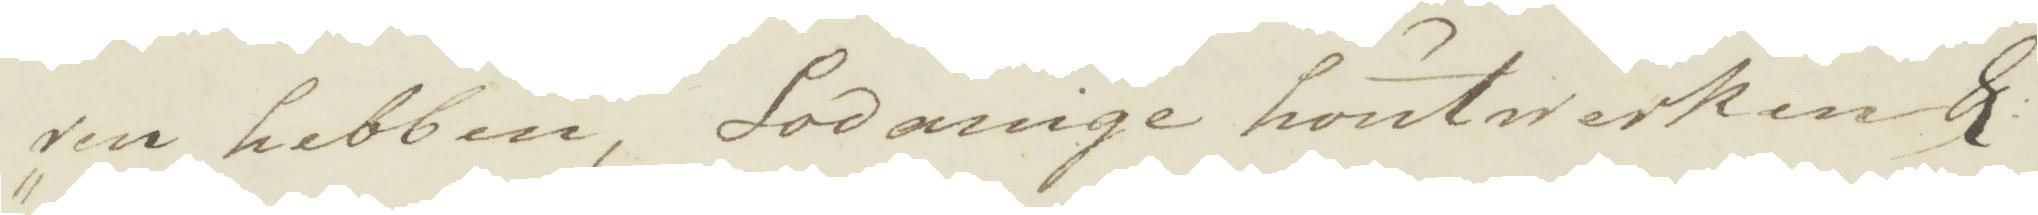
„ven hebben, Sodanige houtwerken &:
